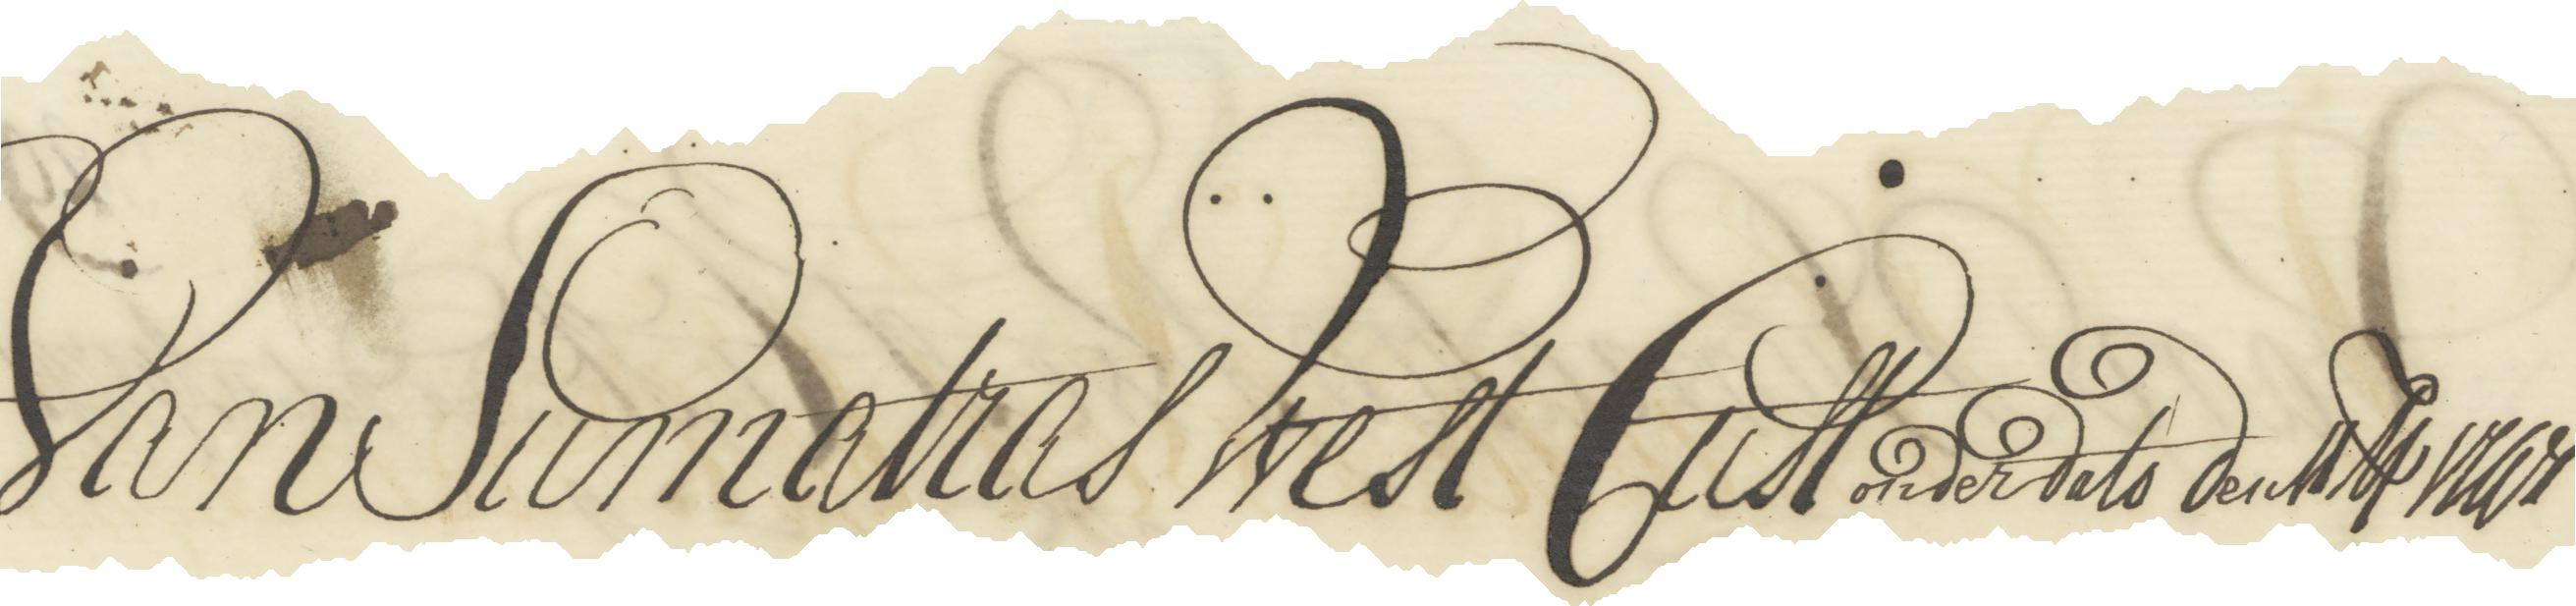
Van Sumatras West Cust onder dato den 11 Ap 1747
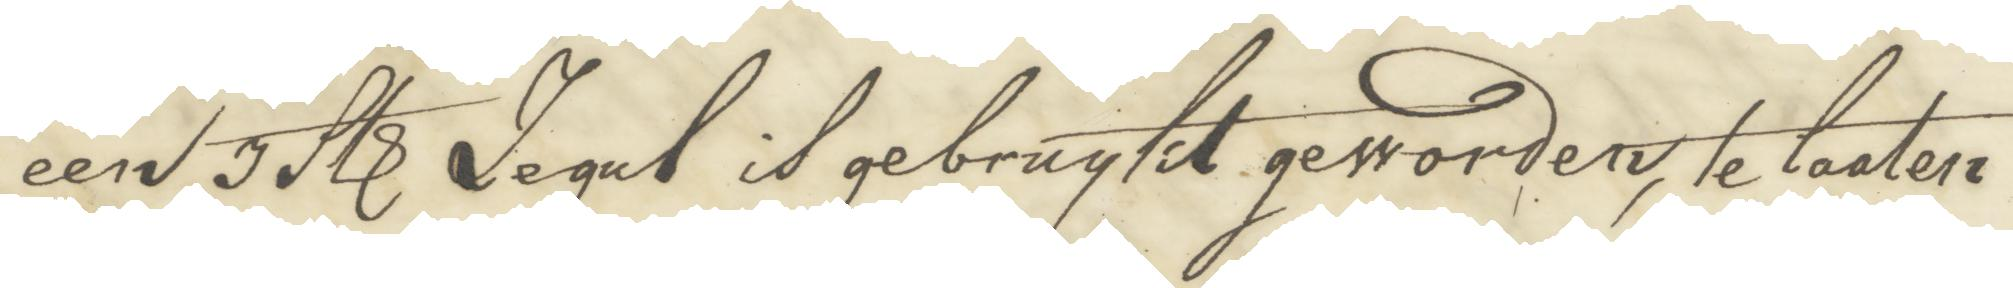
een 3 Stver Zegul is gebruykt geworden, te laaten
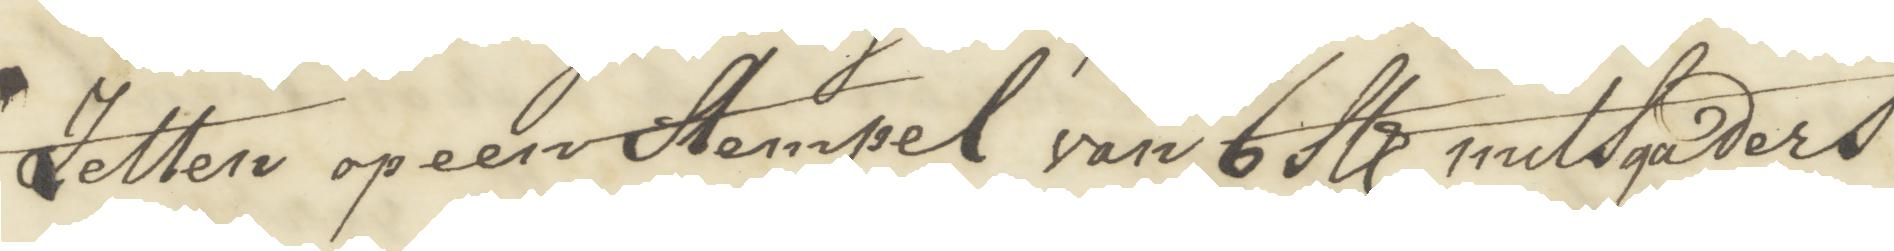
zetten op een Stempel van 6 stver mitsgaders
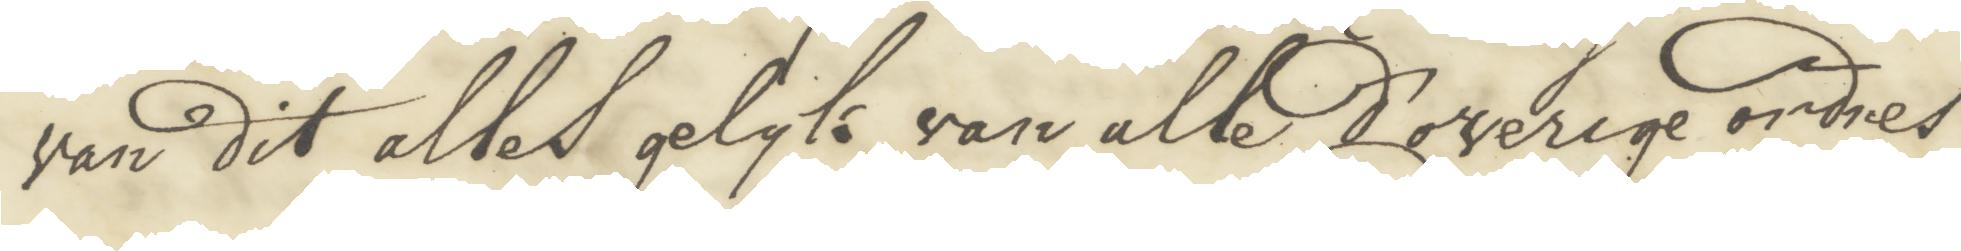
van dit alles gelyk van alle d'overige ordres
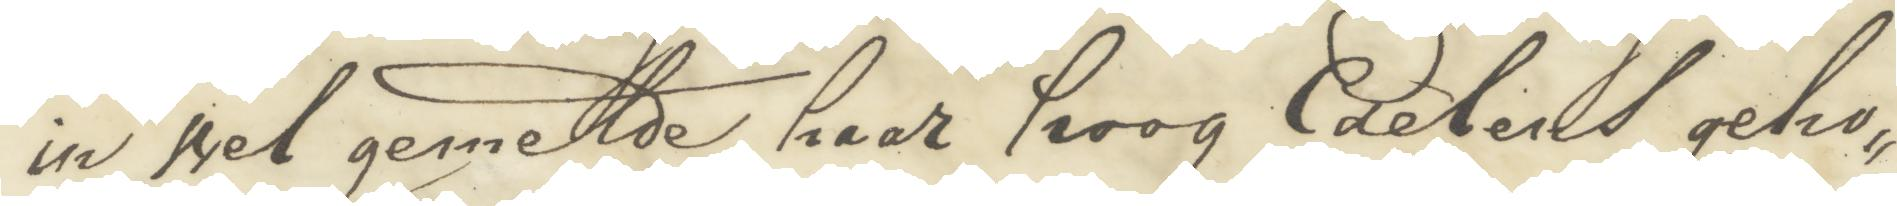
in wel gemelde heer hoog Edelens geho„
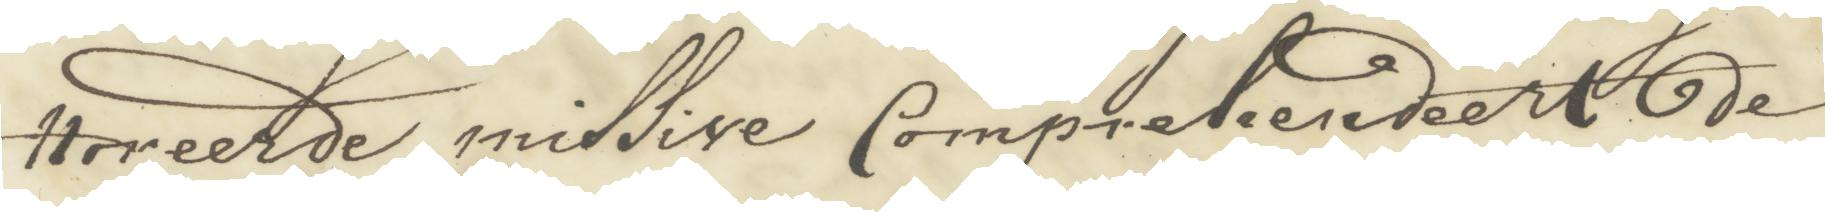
noreerde missive comprehendeert de
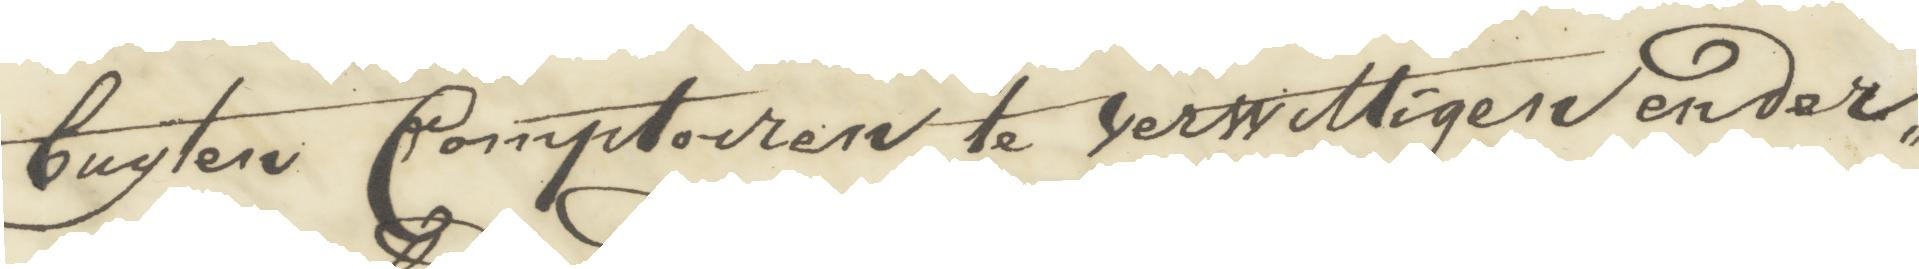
buyten Comptoiren te verwittigen ender„
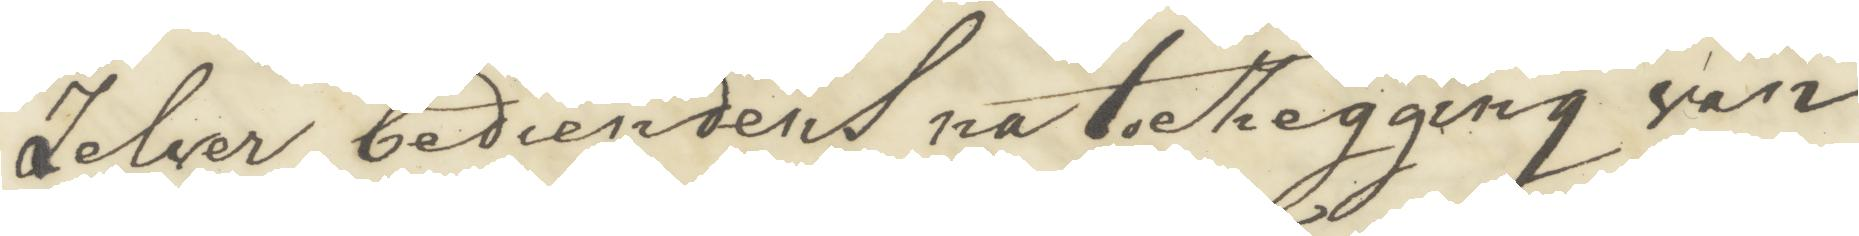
zelver bediendens na toezegging van
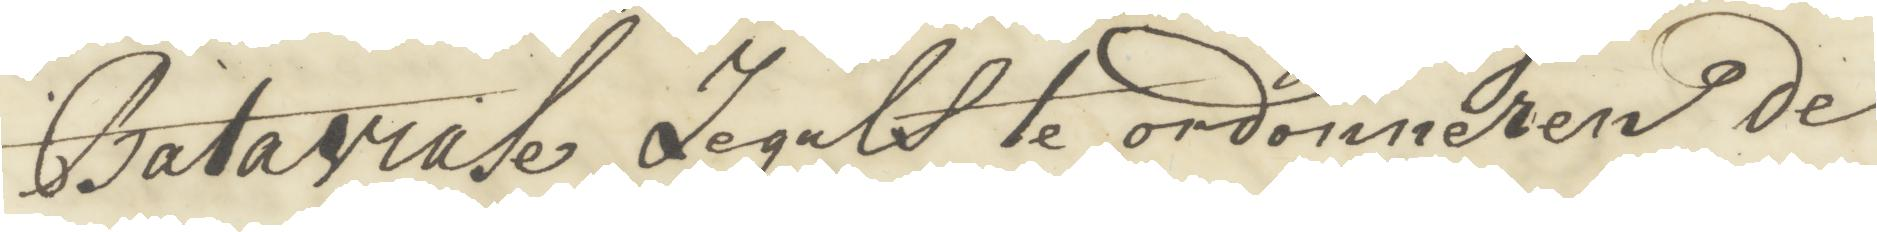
Bataviase Zeguls te ordonneren de
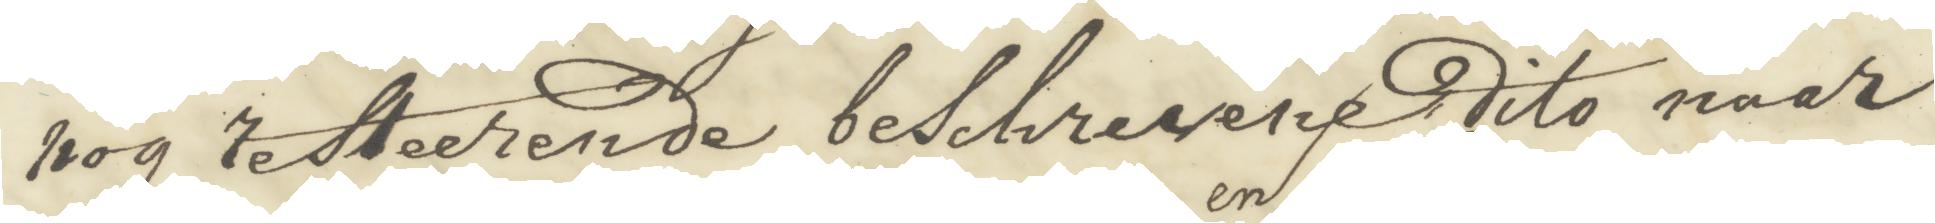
nog resteerende beschrevene dito naar
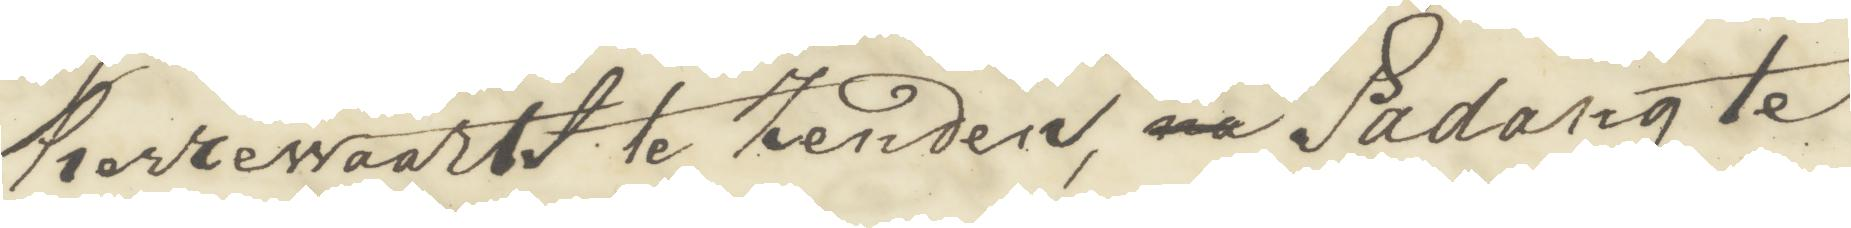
herrewaarts te zenden, na en Padang te
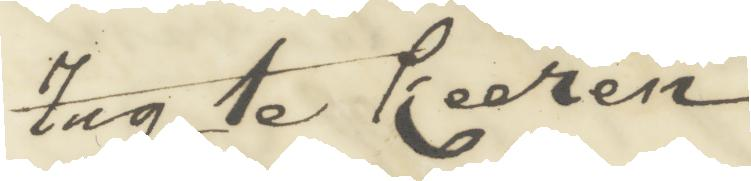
rug te keeren
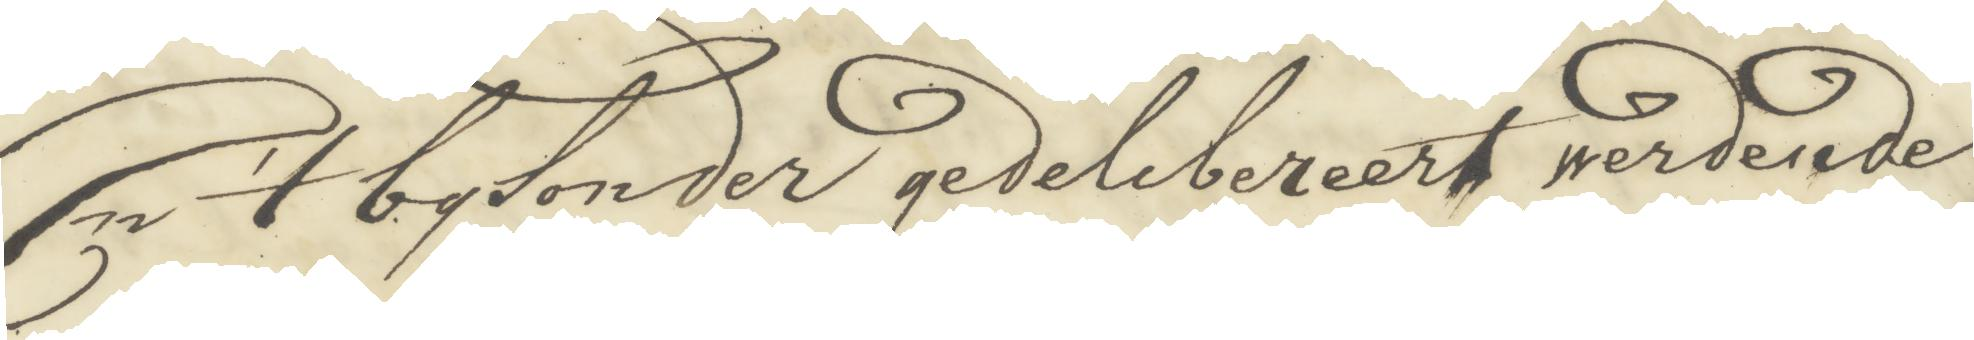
In ’t bysonder gedelibereert werdende
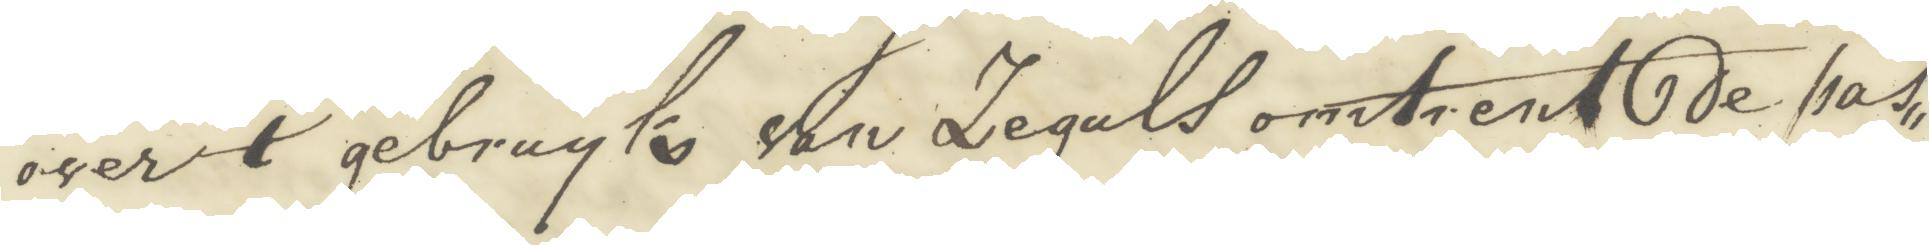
over 't gebruyk van Zeguls omtrent de pas„
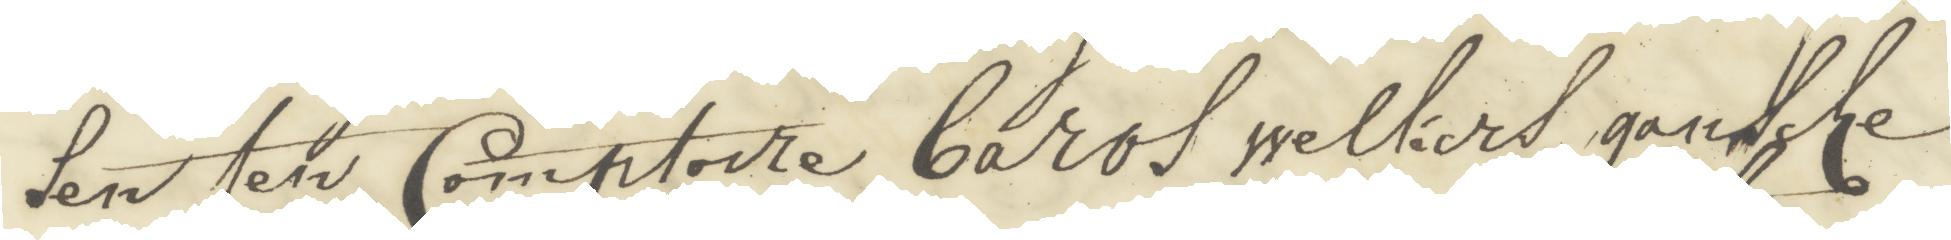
sen ten Comptoire baros welkers gansche
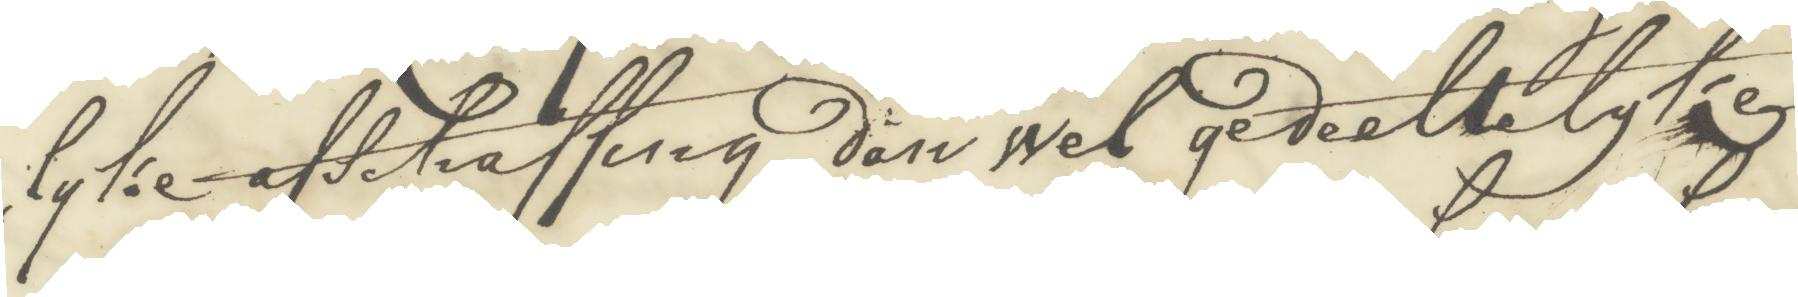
„lyke afschaffing dan wel gedeeltelijken
